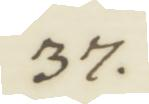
37.
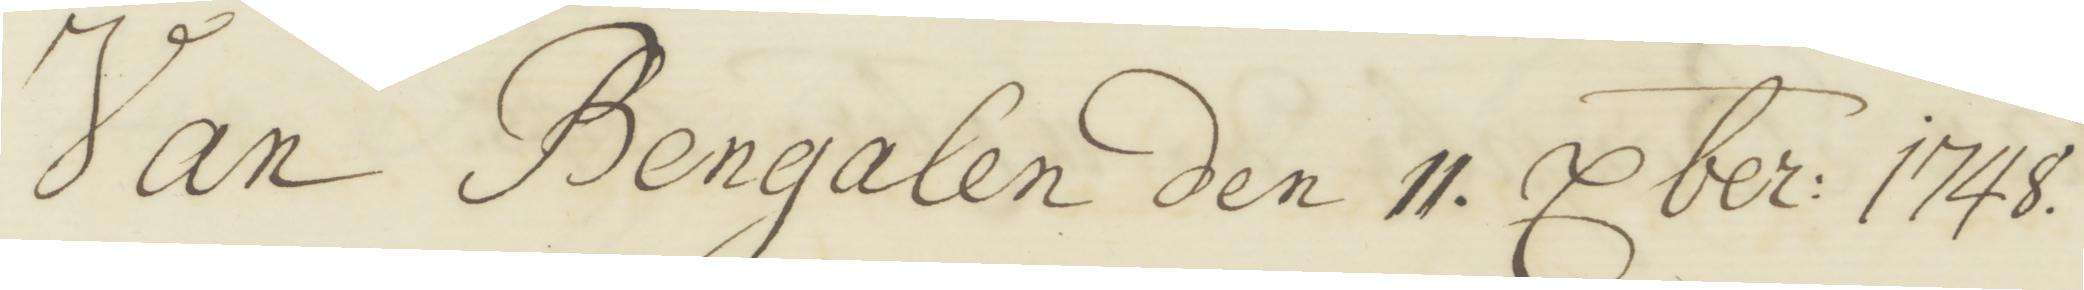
Van Bengalen den 11. xber: 1748.
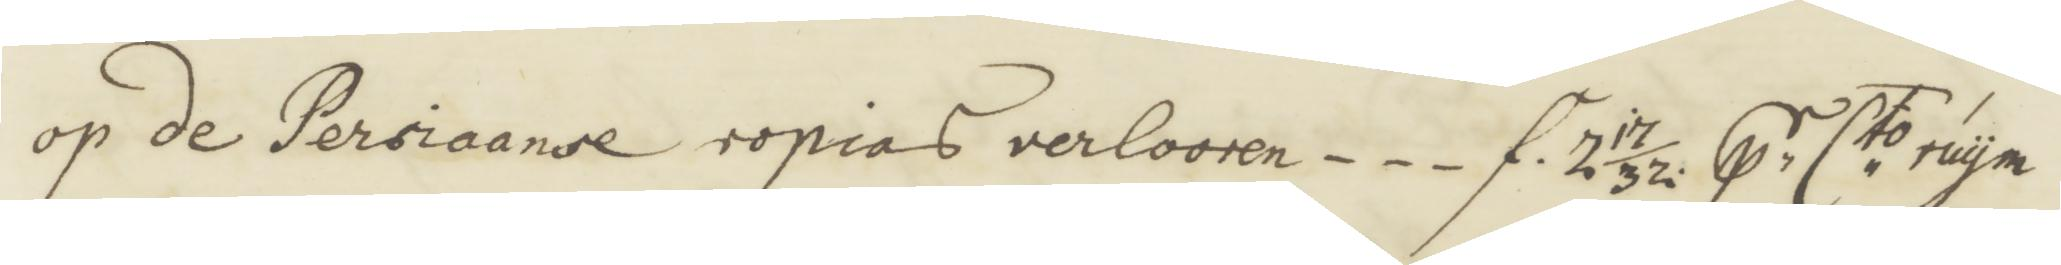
op de Persiaanse ropias verlooren – – – ƒ. 2 17/32. p„rC„to ruijm
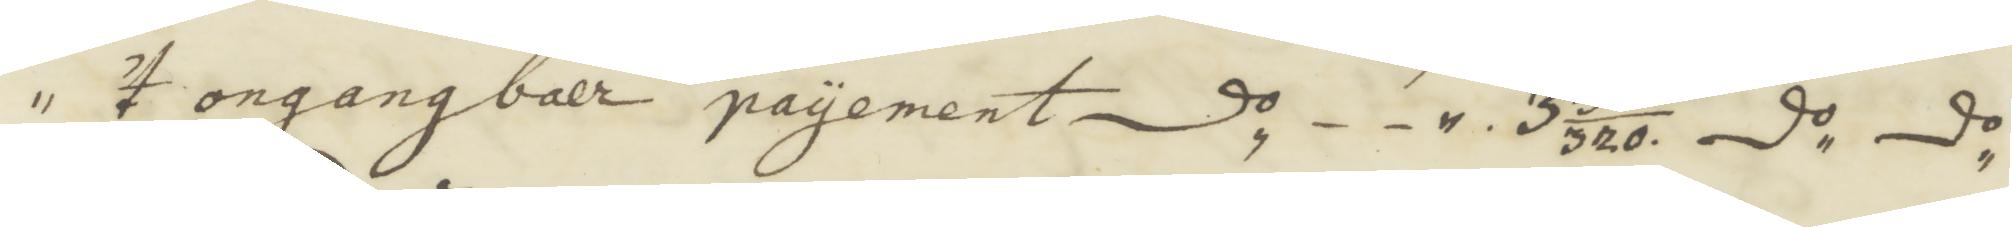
„ ’t ongangbaer paijement _„o – – „ . 3 197/320. _„o _„o
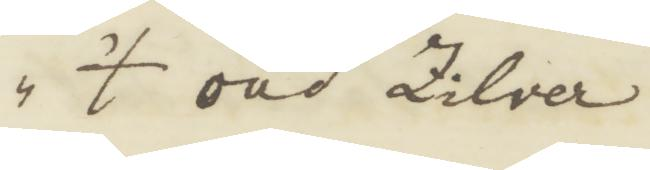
„ 't oud zilver
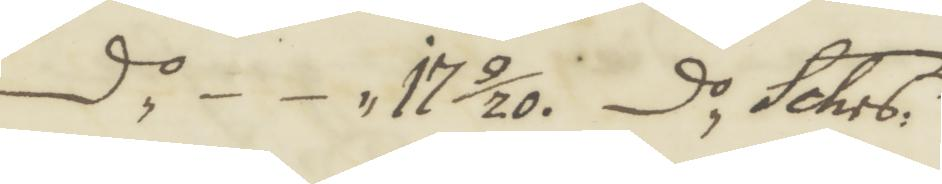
_„o – – „ 17 9/20. _„o schrs:
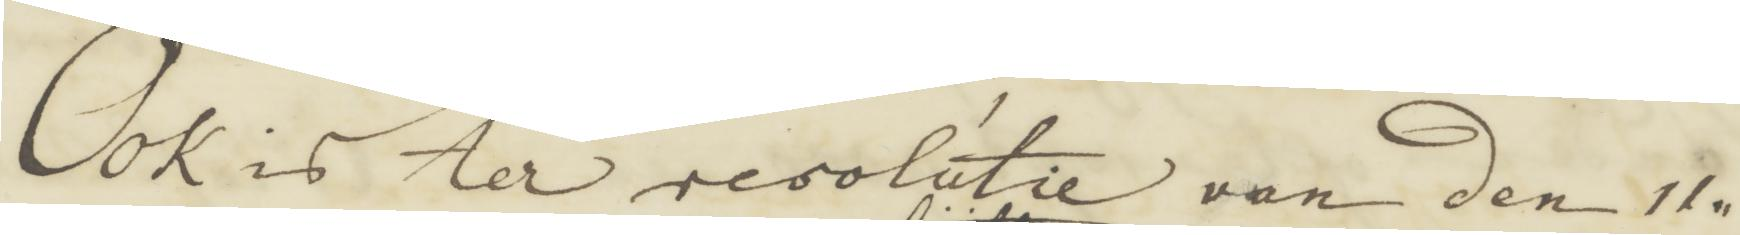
Ook is ter resolutie van den 11„
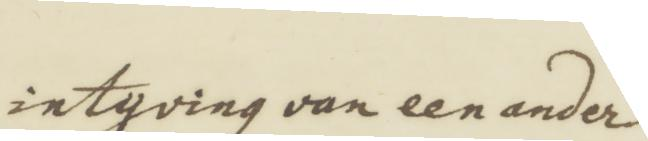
intijving van een ander
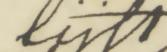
lijft
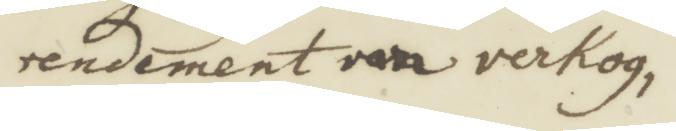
rendement van verkog,
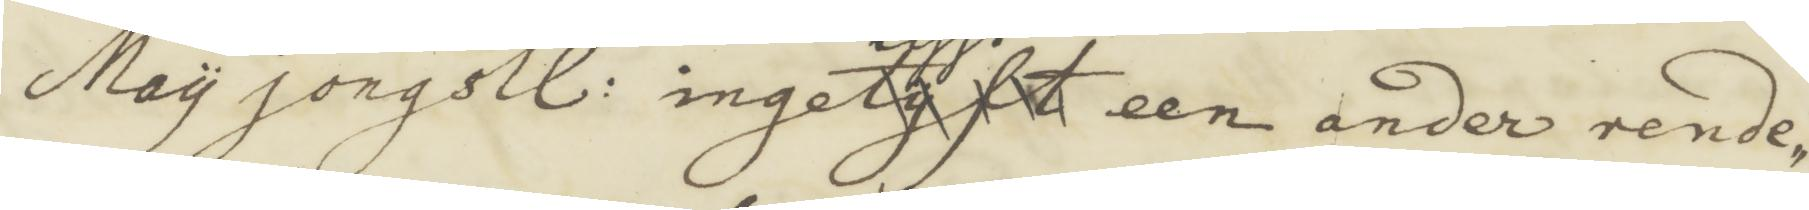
Maij jongstl: ingetijft een ander rende„
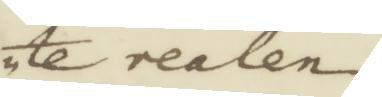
„te realen
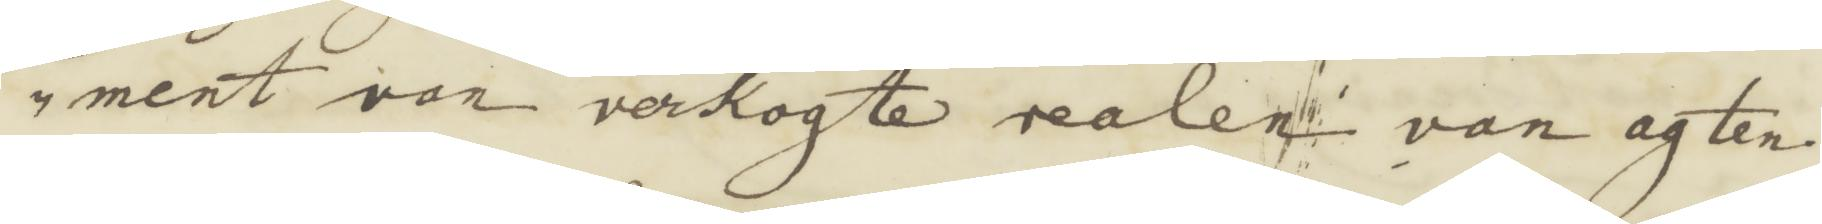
„ment van verkogte realen van agter
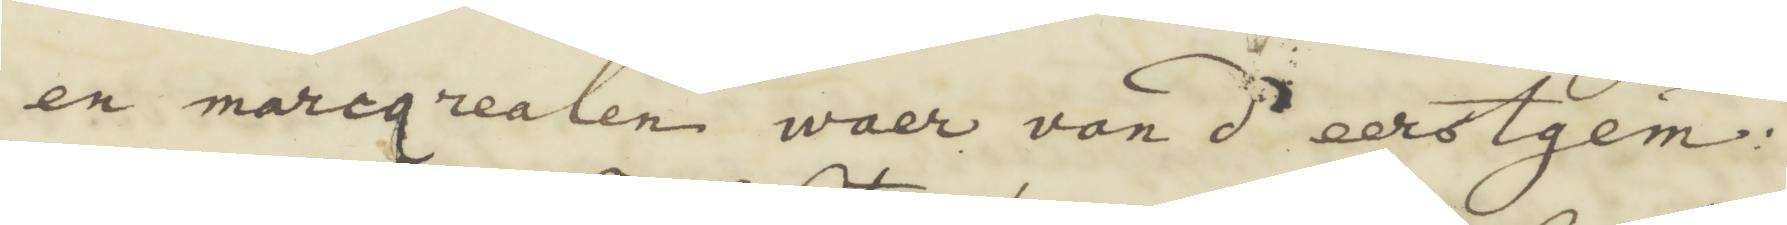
en marcq realen waer van d' eerstgem:
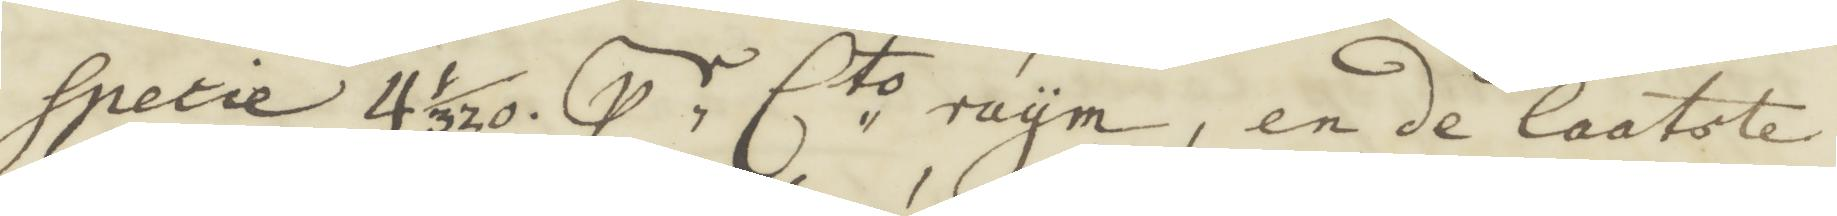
specie 4 1/320. p„rC„to ruijm, en de laatste
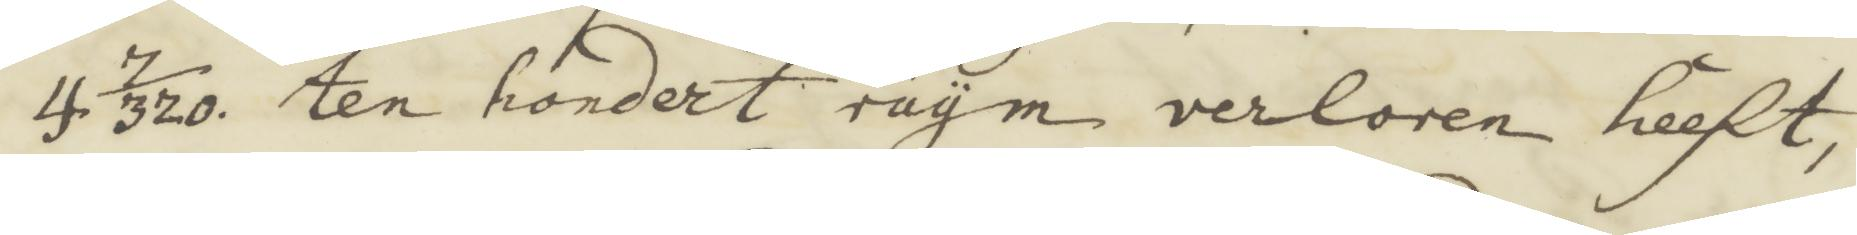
4 7/320. ten hondert ruijm verloren heeft,
